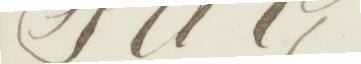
P d G
